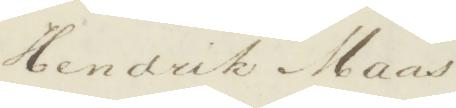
Hendrik Maas
